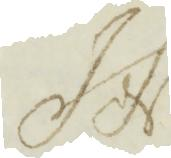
JJr
